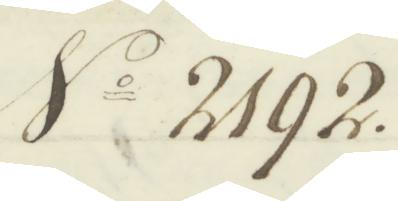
N=o 2192.
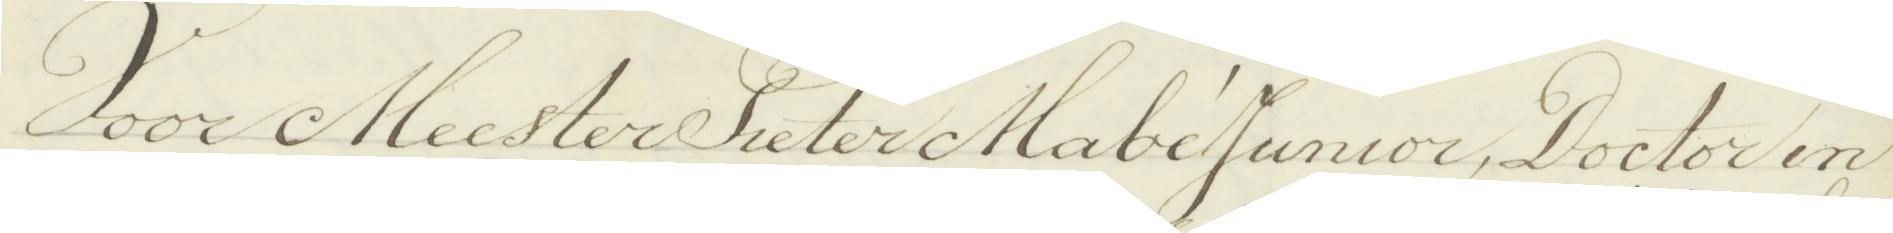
Voor Meester Pieter Mabé Junior, Doctor in
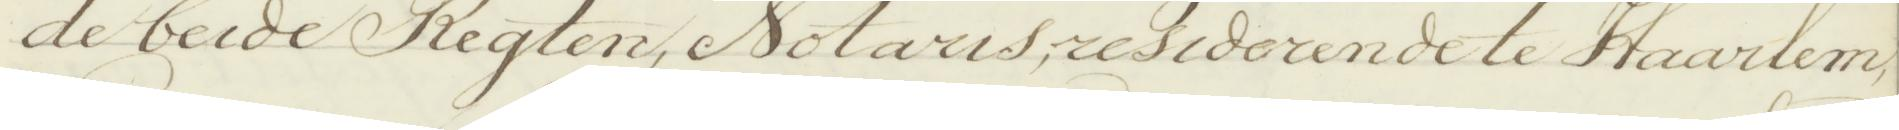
de beide Regten, Notaris, residerende te Haarlem,
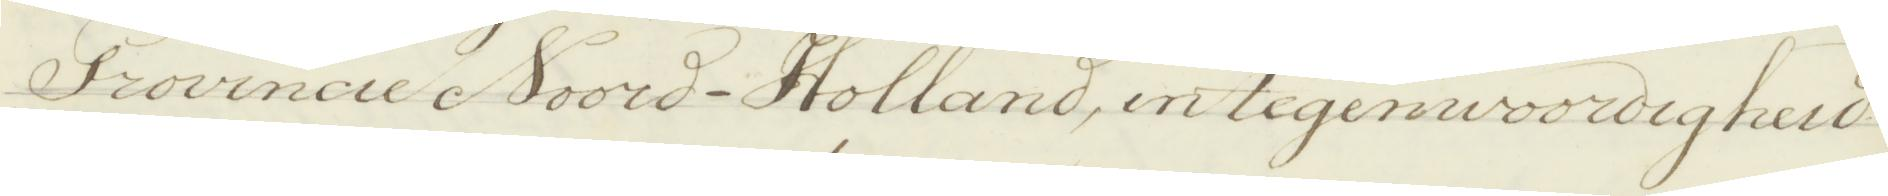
Provincie Noord-Holland, in tegenwoordigheid
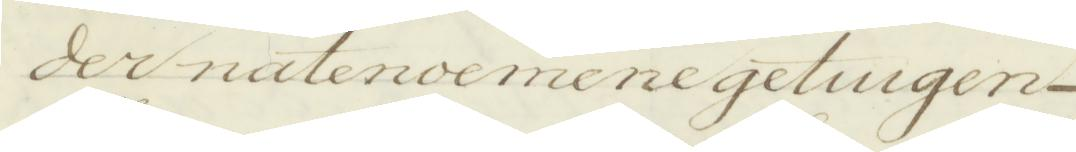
der natenoemene getuigen-
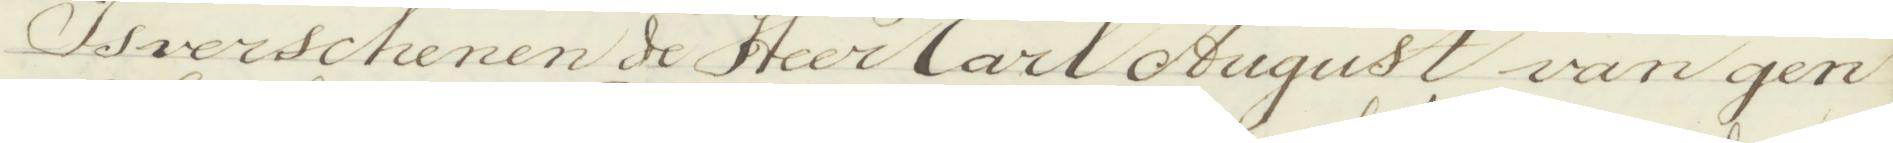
Is verschenen de Heer Carl August van gen
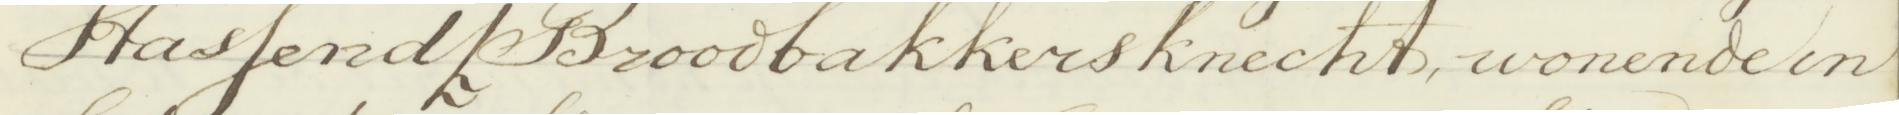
Hassend ¶ Broodbakkersknecht, wonende in
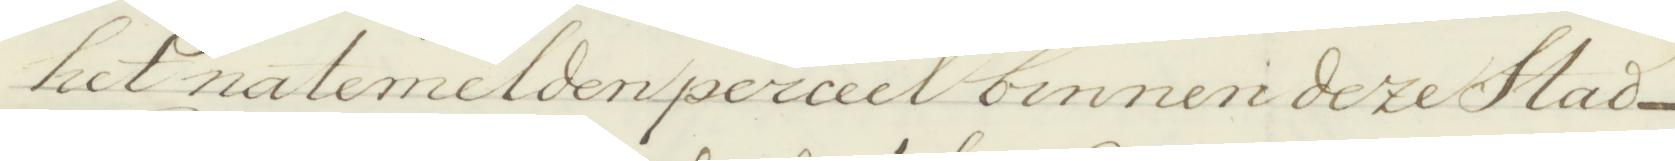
het natemelden perceel binnen deze Stad-
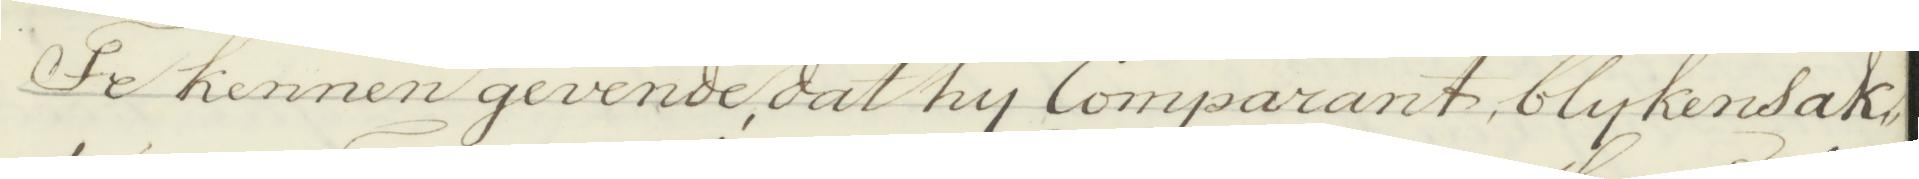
Te kennen gevende, dat hy Comparant, blykens ak„
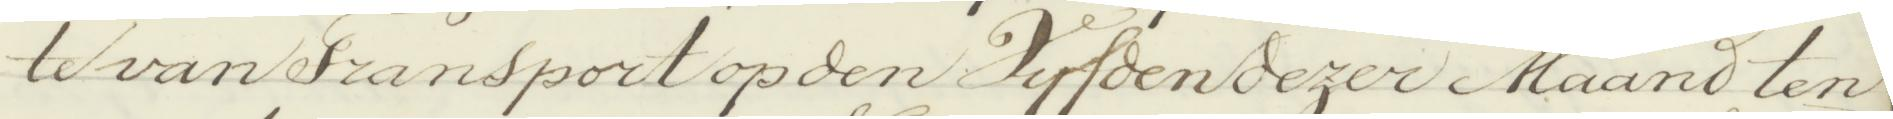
te van Transport op den Vyfden dezer Maand ten
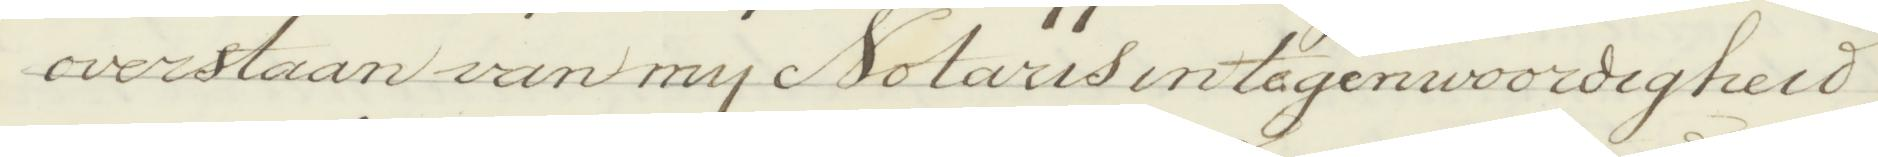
overstaan van my Notaris in tegenwoordigheid
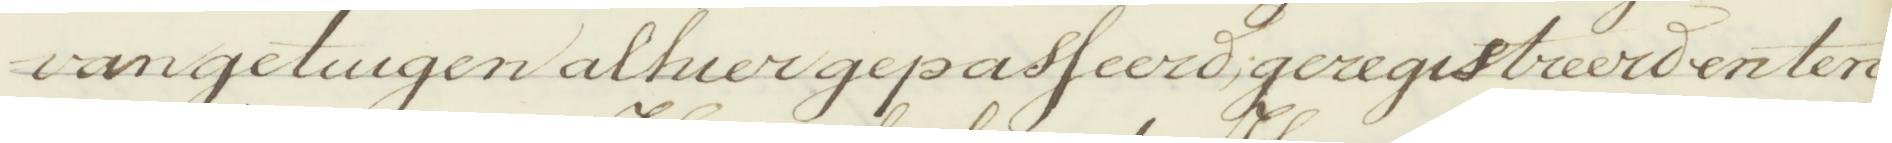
van getuigen alhier gepasseerd, geregistreerd en ten
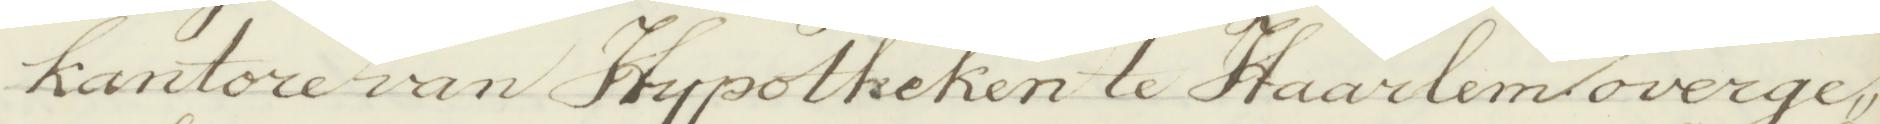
kantore van Hypotheken te Haarlem overge„
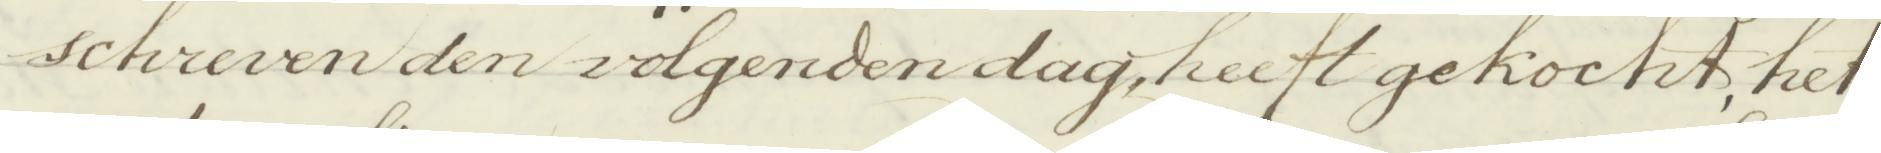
schreven den volgenden dag, heeft gekocht, het
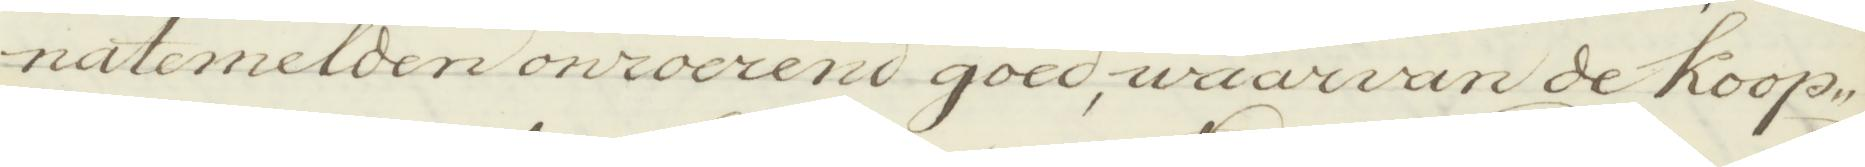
natemelden onroerend goed, waarvan de koop„
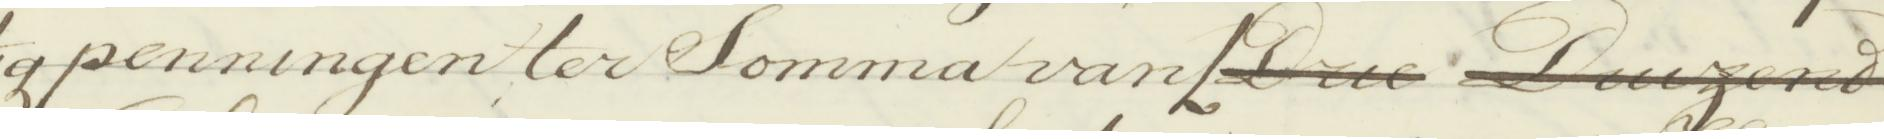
penningen ter Somma van Drie Duizend
